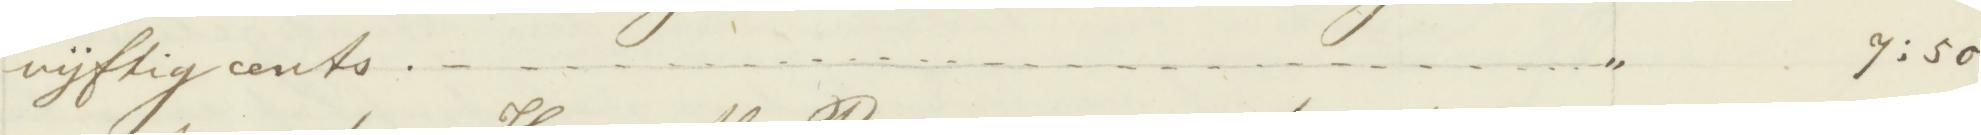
vijftig cents. - - - - - - - - - - - - - - - - - - - - - - - - - . . . „ 7: 50
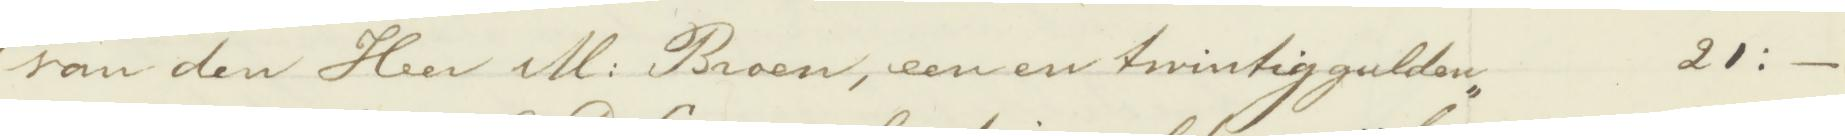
van den Heer M: Broen, een en twintig gulden„ 21: —
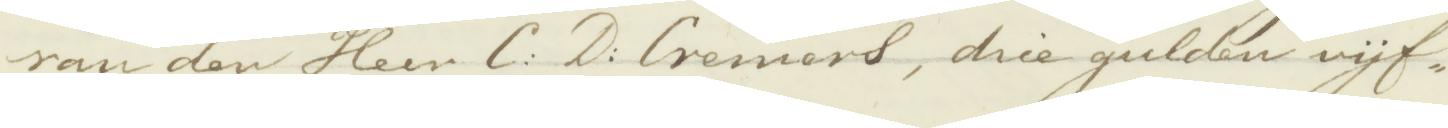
van den Heer C: D: Cremers, drie gulden vijf„
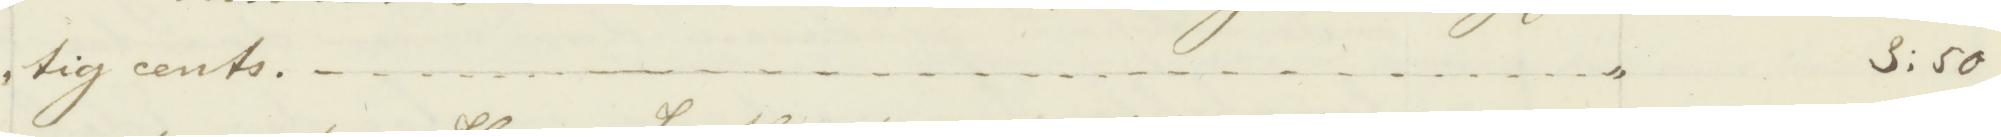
„tig cents. - - - - - - - - - - - - - - - - - - - - - - - - - - - - - - „ 3: 50
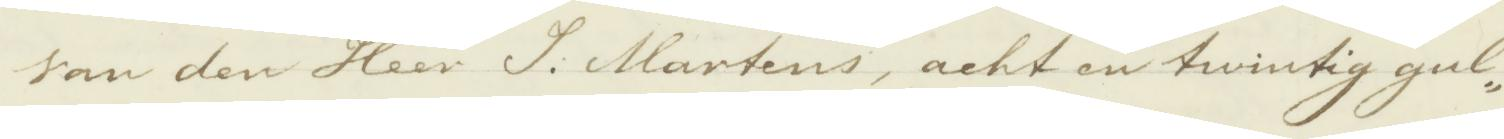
van den Heer I: Martens, acht en twintig gul„
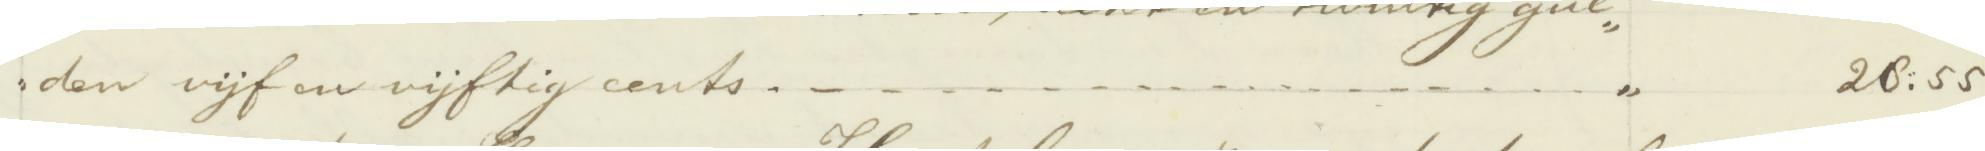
„den vijf en vijftig cents. - - - - - - - - - - - - - - - - - - „ 28:55
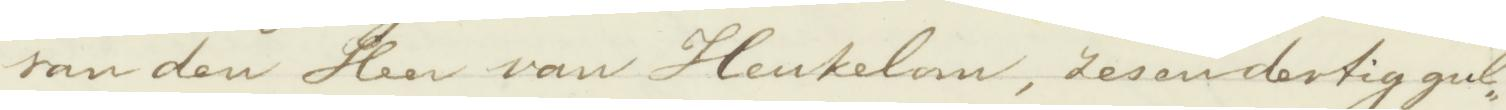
van den Heer van Heukelom, zes en dertig gul„
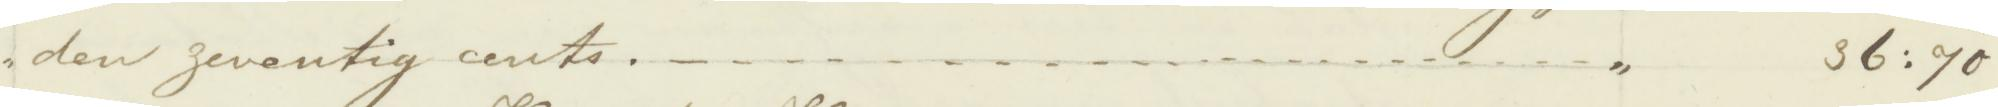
„den zeventig cents. - - - - - - - - - - - - - - - - - - - - - - - „ 36:70
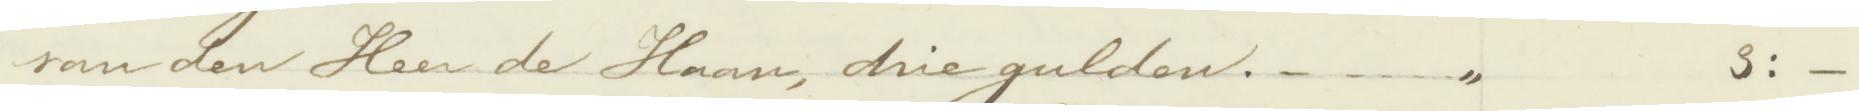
van den Heer de Haan, drie gulden. - - - - - „ 3: —
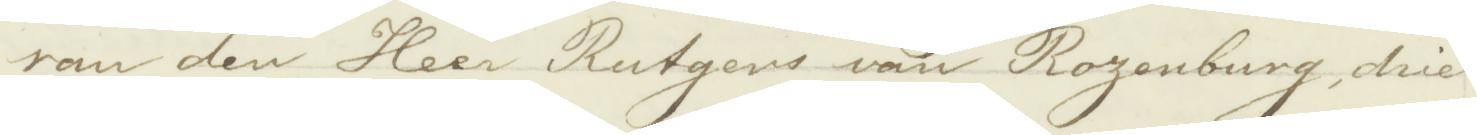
van den Heer Rutgers van Rozenburg, drie
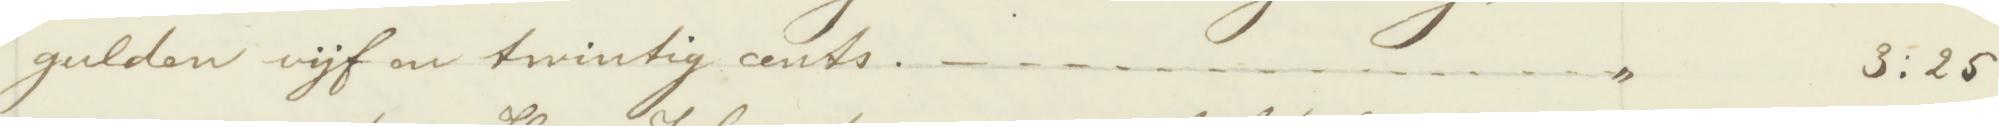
gulden vijf en twintig cents. - - - - - - - - - - - . - - -„ 3: 25
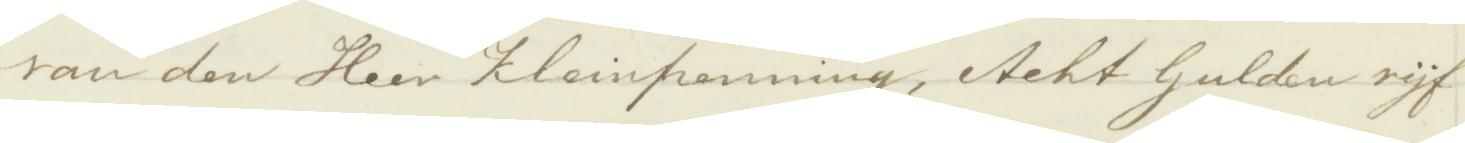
van den Heer Kleinpenning, Acht Gulden vijf
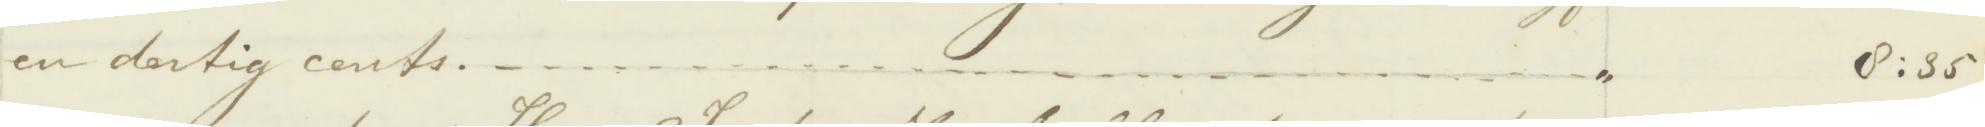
en dertig cents. - - - - - - - - - - - - - - - - - - - - - - - - - - - - - - „ 8: 35
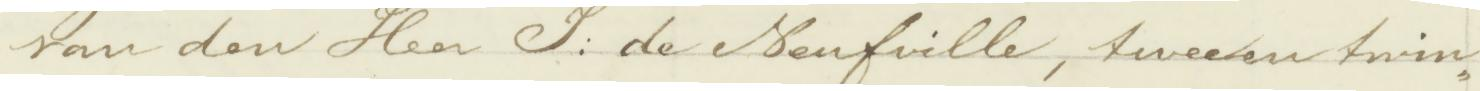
van den Heer I: de Neufville, twee en twin„
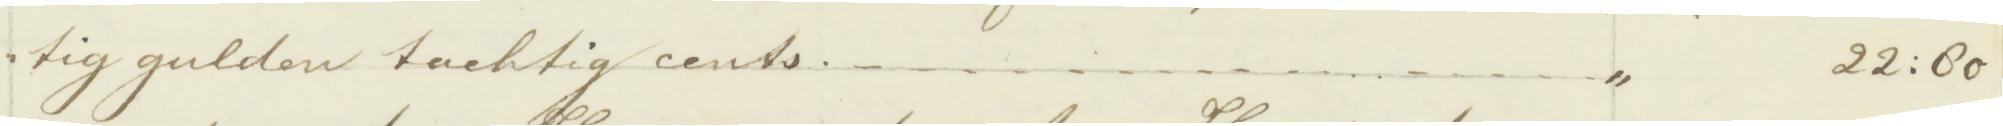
„tig gulden tachtig cents. - - - - - - - - - - - . . - - - - - - „ 22: 80
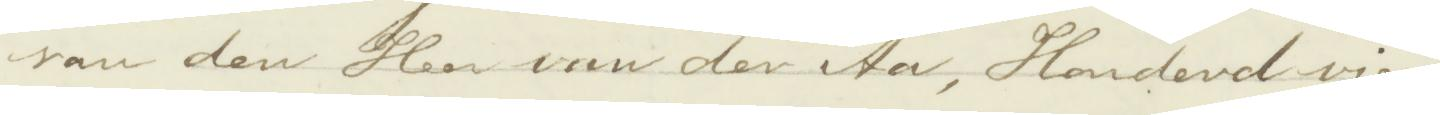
van den Heer van der Aa, Honderd vier
